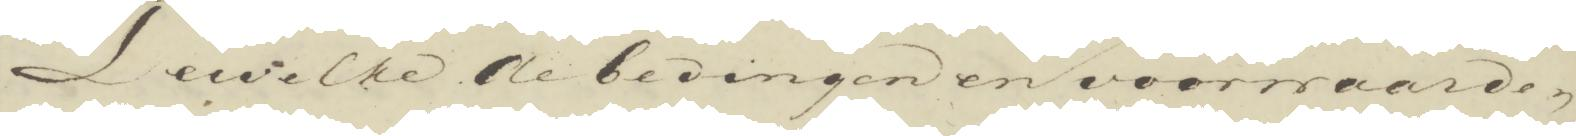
Dewelke de bedingen en voorwaarden
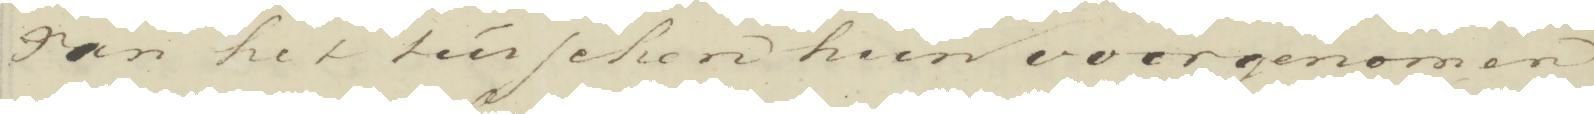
van het tusschen hun voorgenomen
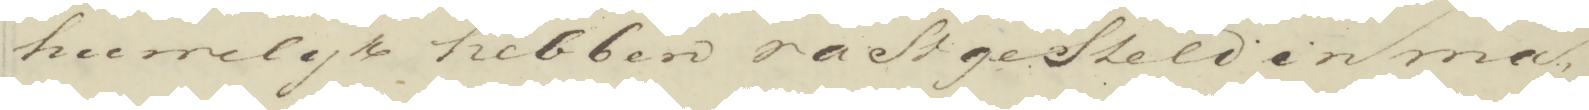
huwelyk hebben vastgesteld in ma„
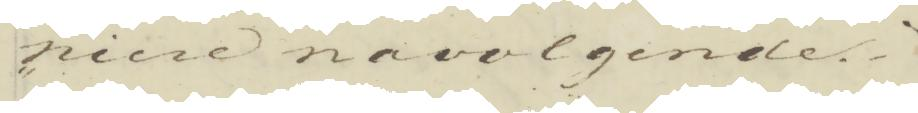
„niere navolgende
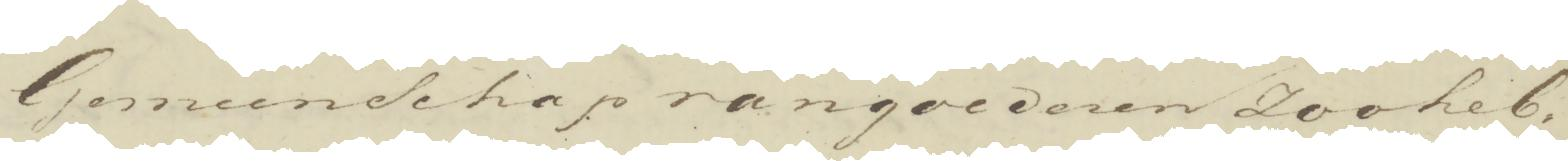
Gemeenschap vangoederen zoo heb„
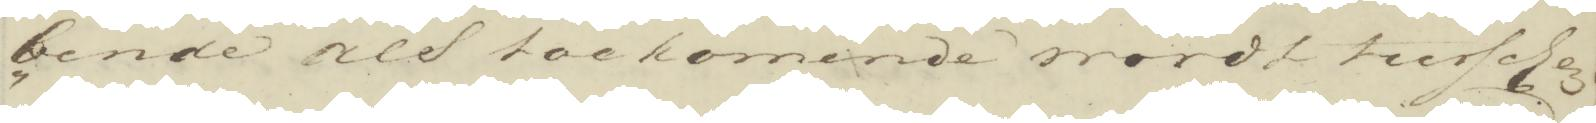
„bende als toekomende wordt tusschen
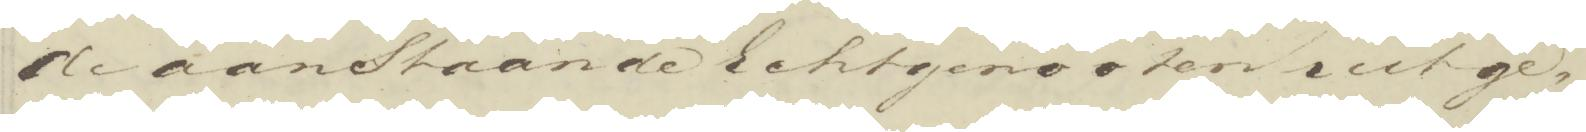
de aanstaande Echtgenooten uitge„
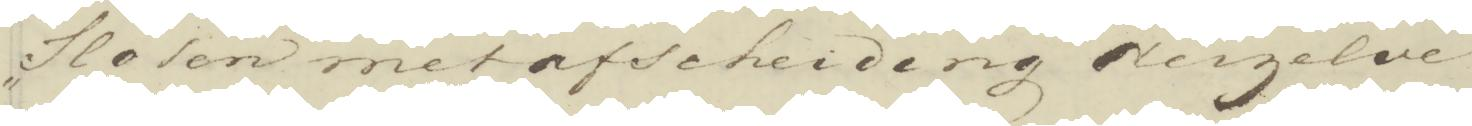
„sloten met afscheiding deszelve
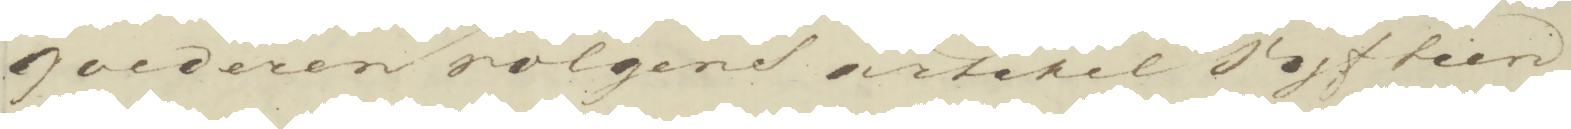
goederen volgens artikel Vyftien
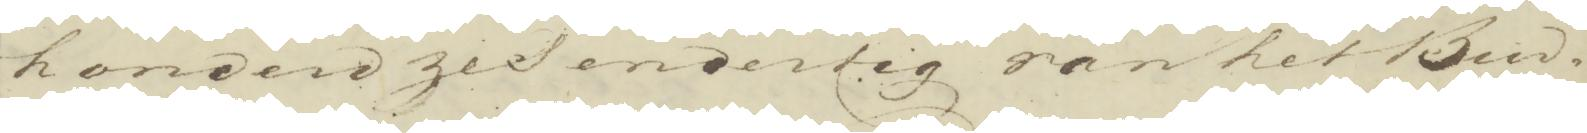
honderd zes endertig van het Bur„
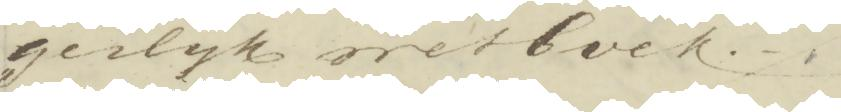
gerlyk wetboek. -
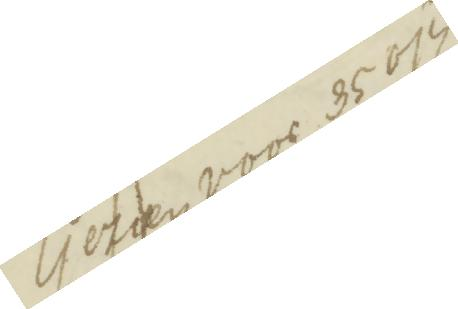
Gezien voor 35 opC.tn
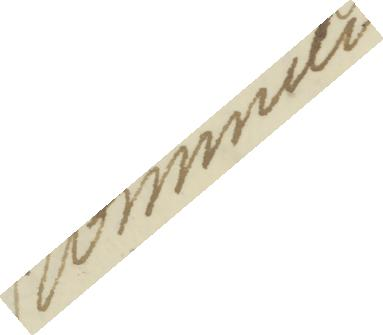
CrommeliN
